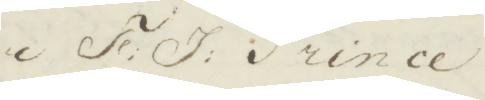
F: I: Prince
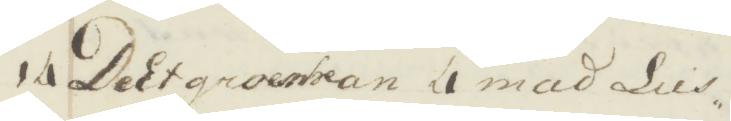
14 De Etgroenvan 4 mad Lies„
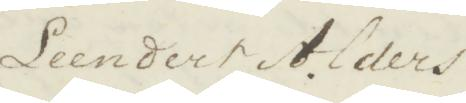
Leendert Alders
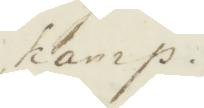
„kamp.
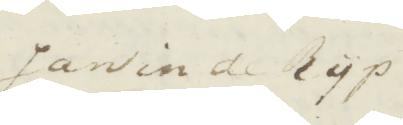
Jan in de Rijp
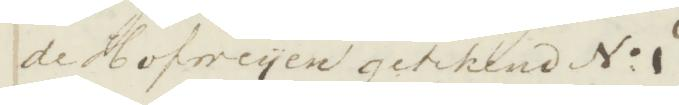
de Hofweijen getekend N:o 1
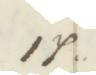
17„
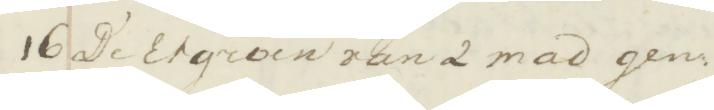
16 De Etgroen van 2 mad gen:
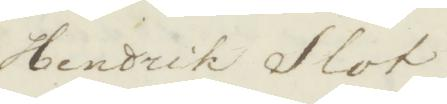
Hendrik Slot
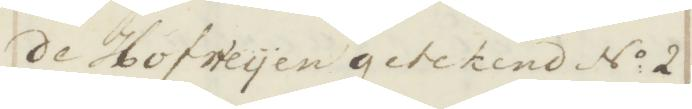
de Hofweijen getekend N:o 2
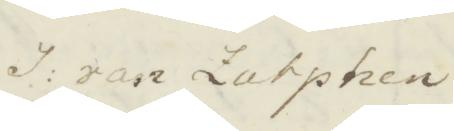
I: van Zutphen
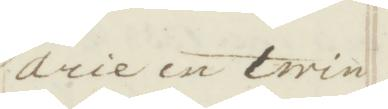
drie en twin
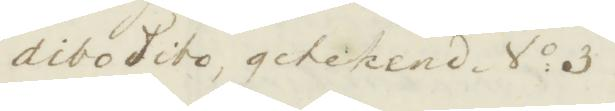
dito Tito, getekend N:o 3
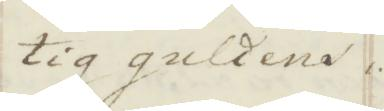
tig guldens.
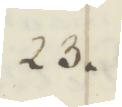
23„
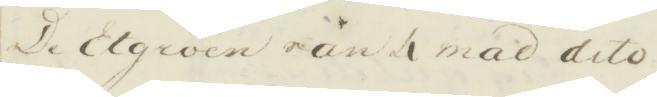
De Etgroen van 4 mad dito
